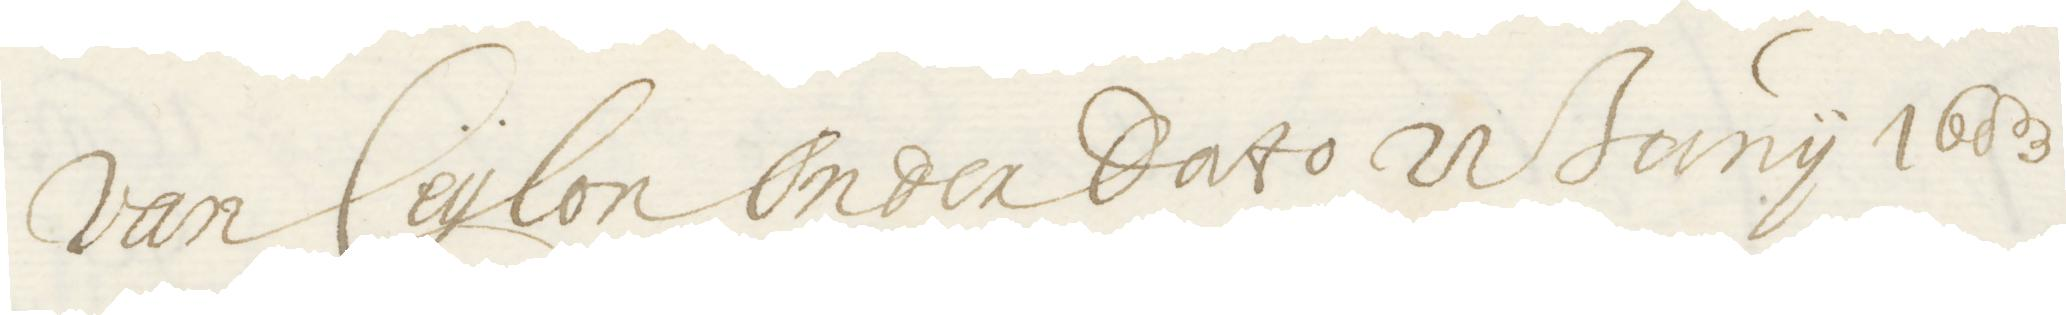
Van Ceijlon onder dato 21 Iunij 1683
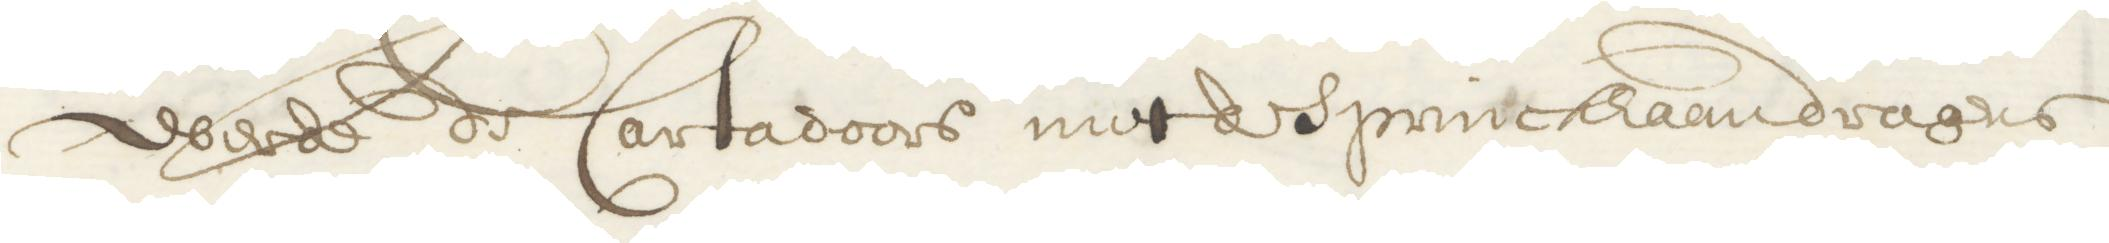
werde de Cartadoors met de sprinckhaandragers
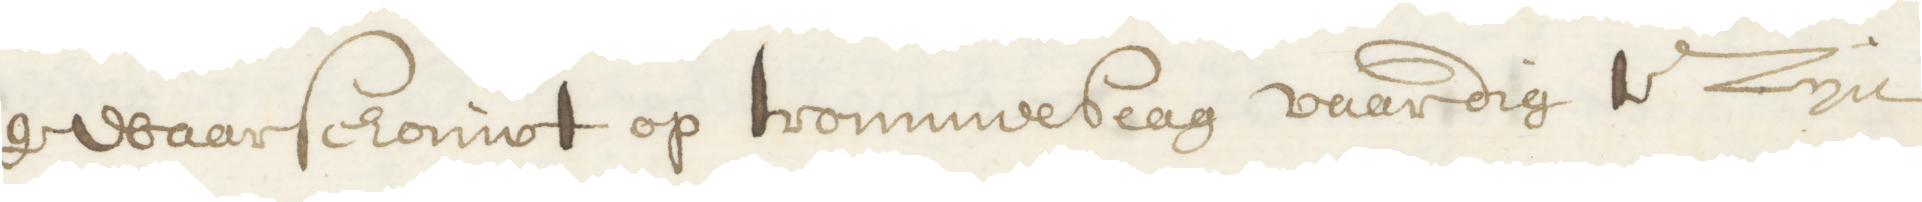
gewaarschouwt op trommelslag vaardig te zijn
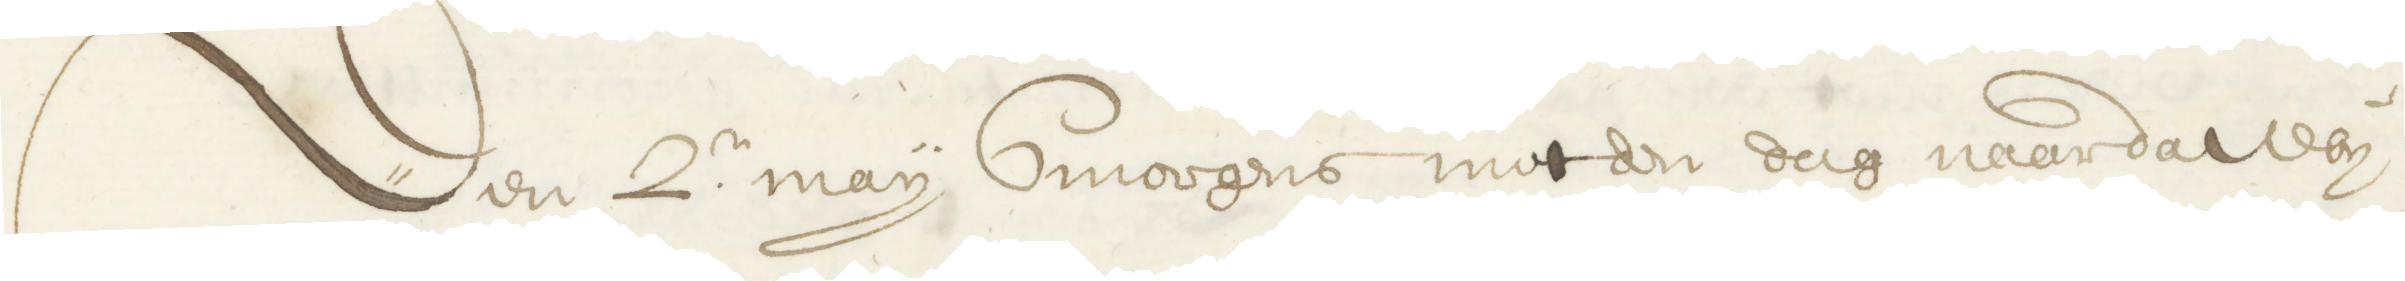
Den 2:n maij smorgens met den dag naardat wij
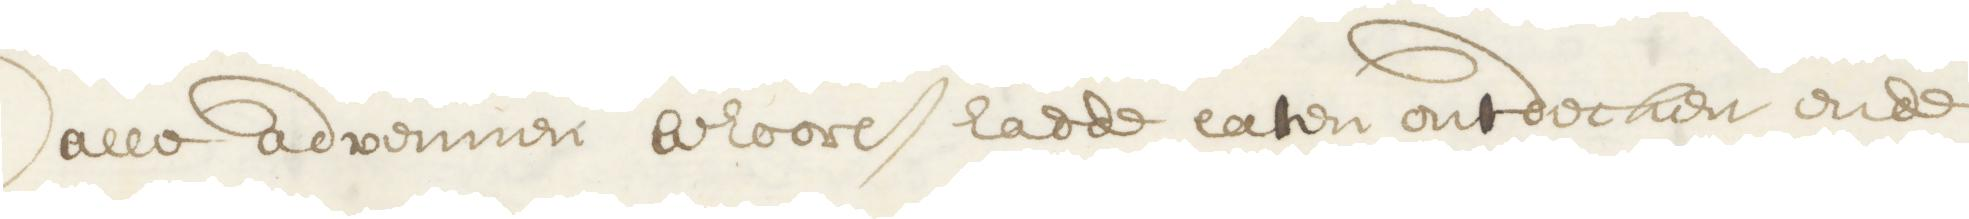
alle advennen behoorlijk hadde laten ontdecken ende
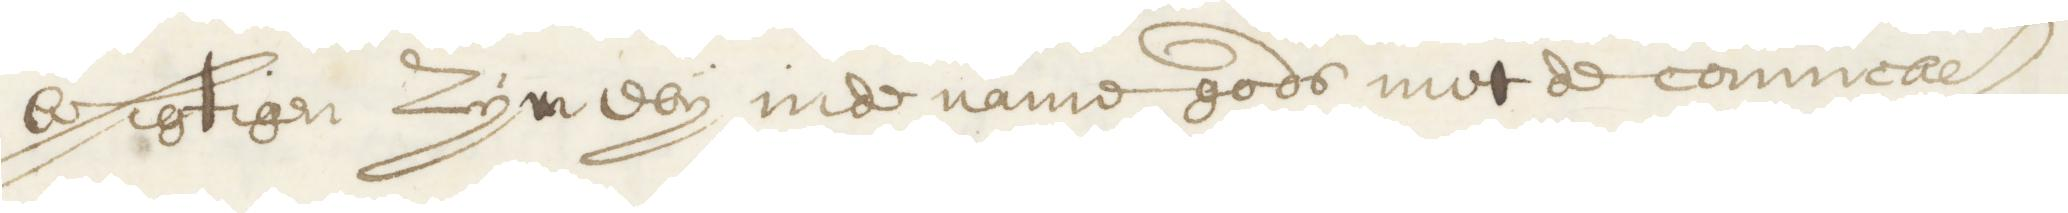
besigtigen zijn wij inde name gods met de conincklijk
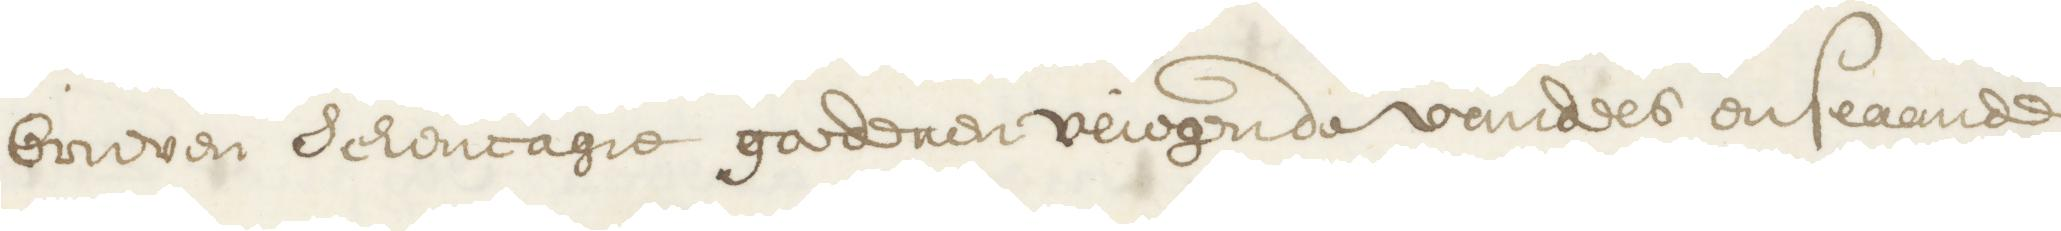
brieven schencagie goederen vliegende vendels en slaande
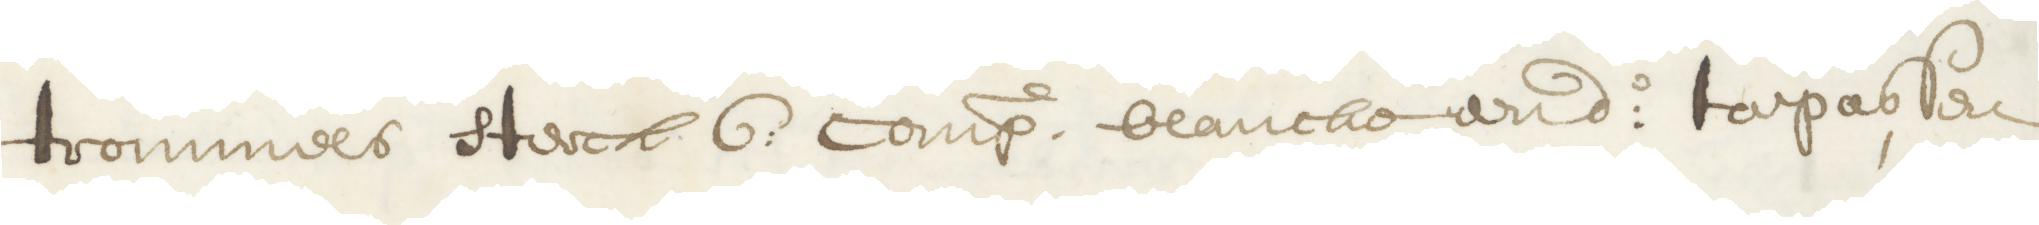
trommels sterck 6: comp. blancke en d:o toepassen
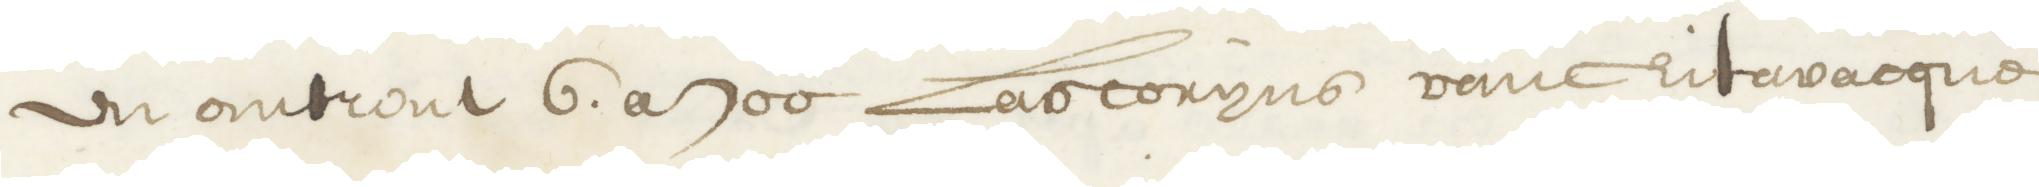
en omtrent 6. a700 Lascorijns van chitavacque
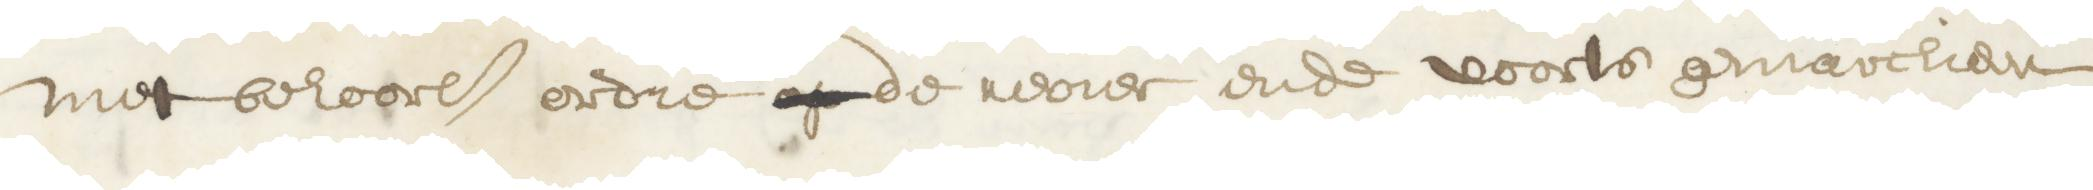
met behoorlijk ordre op de revier ende voorts gemarchier
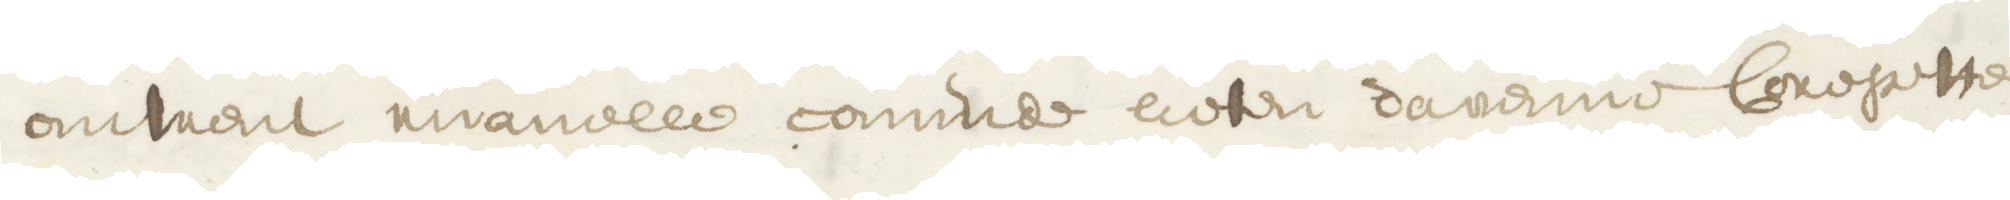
omtrent rivanelle comende lieten davenie Corepette
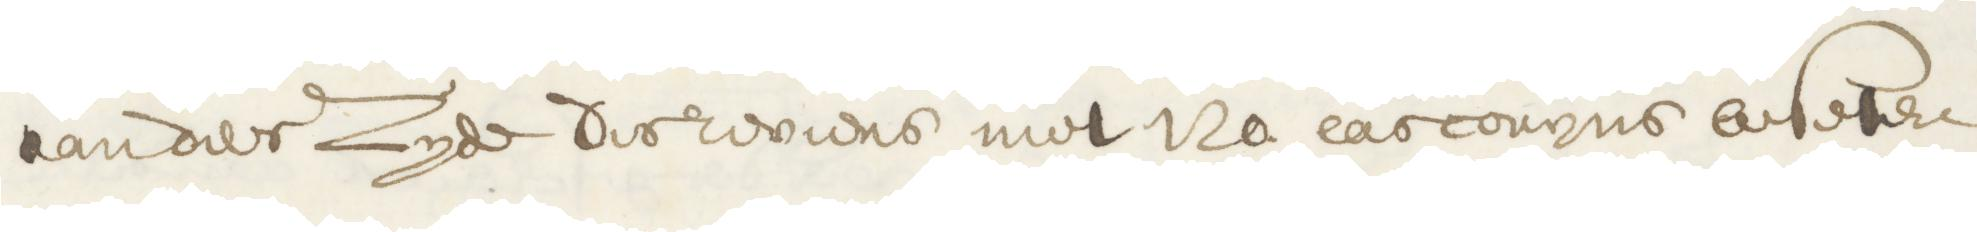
aan dees zijde des reviers met 120. lascorijns beseten
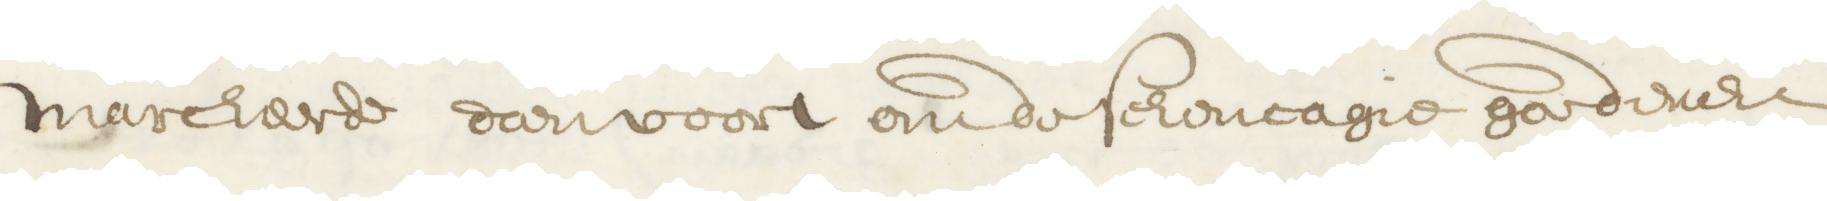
marcheerde doen voort om de schencagie goederen
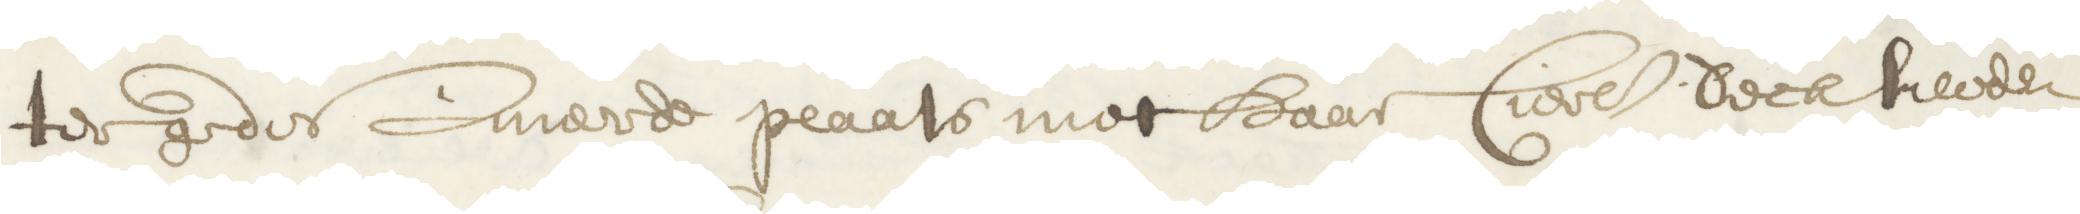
ter gedestineerde plaats met haar Cierelijk deckkleden
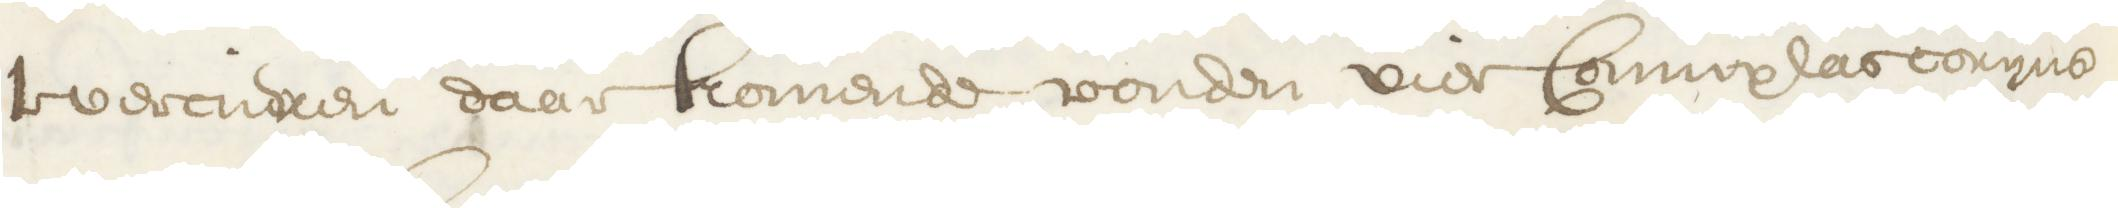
te vercieren daar komende vonden vier Comiexlas corijns
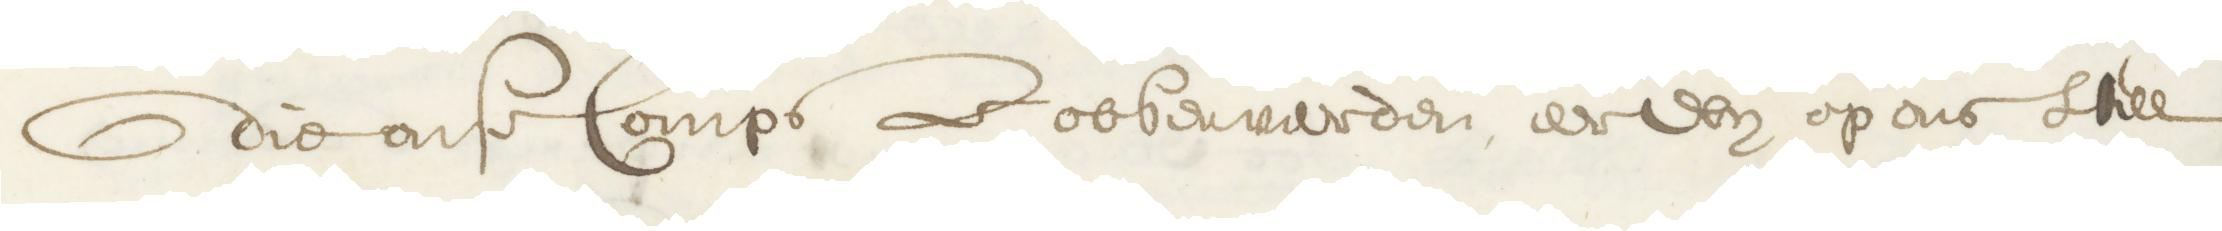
die onse Comps observeerden, eer wij op ons still
